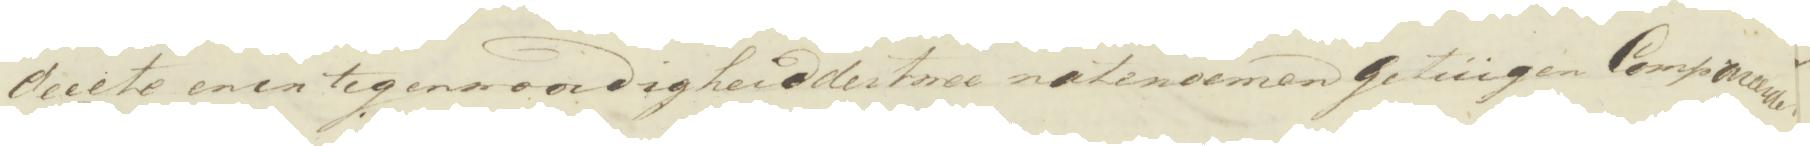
deelte en in tegenwoordigheid der twee na te noemen Getuigen Compareerde
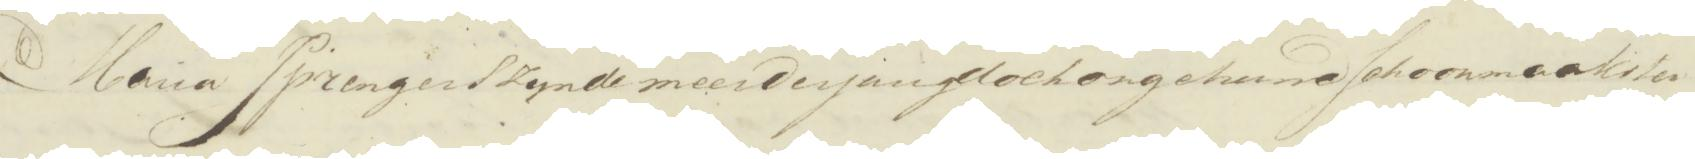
Maria Springers Zynde meerderjarige doch ongehuwd schoonmaakster
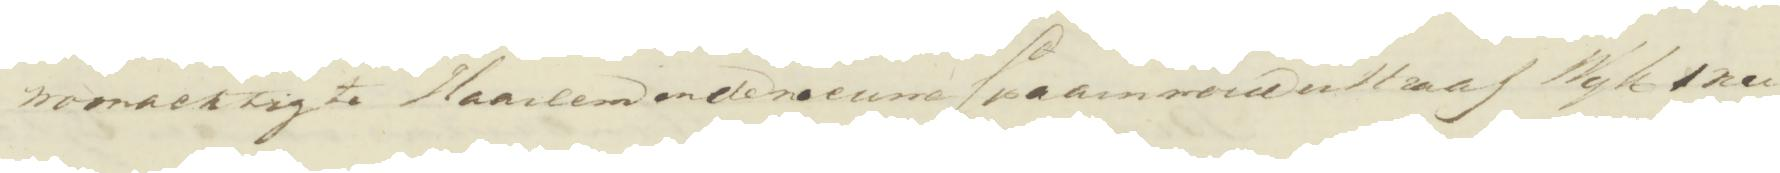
woonachtig te Haarlem in de nieuwe Spaarnwouderstraat Wyk 1 nu=
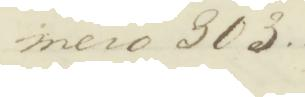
mero 303.
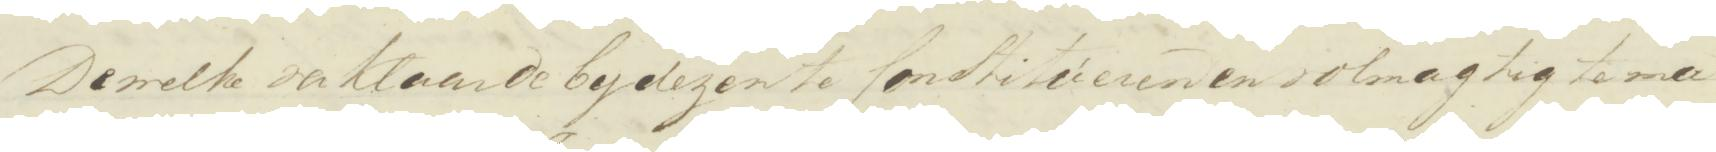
Dewelke vaklaarde by dezen te Constitueren en volmagtig te ma
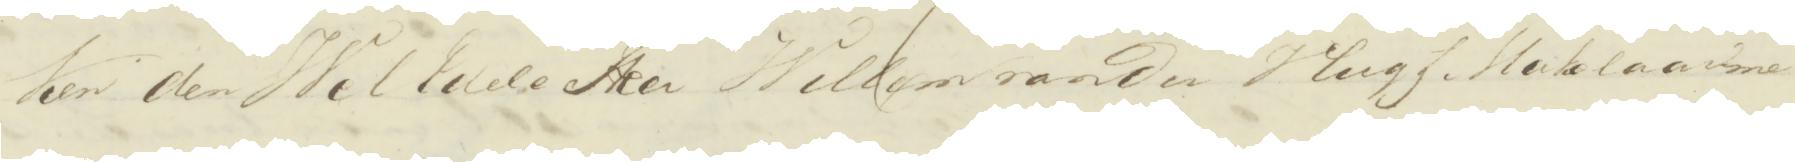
ken den Wel Edele Heer Willem van der Vlugt. Makelaar me
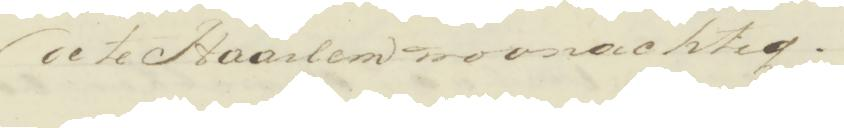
de te Haarlem woonachtig.
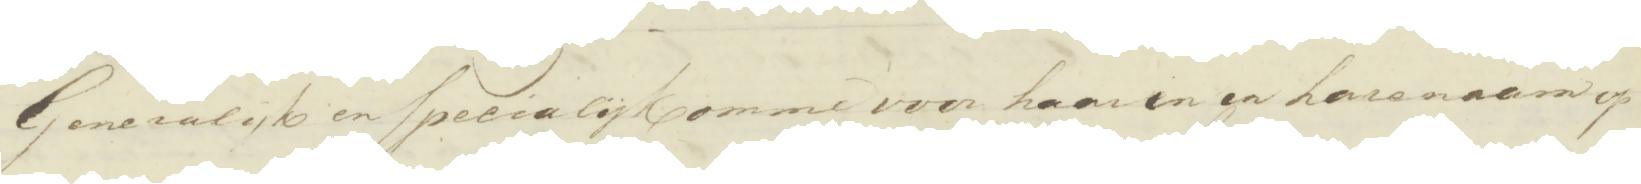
Generalijk en specialijk omme voor haar in en hare naam op
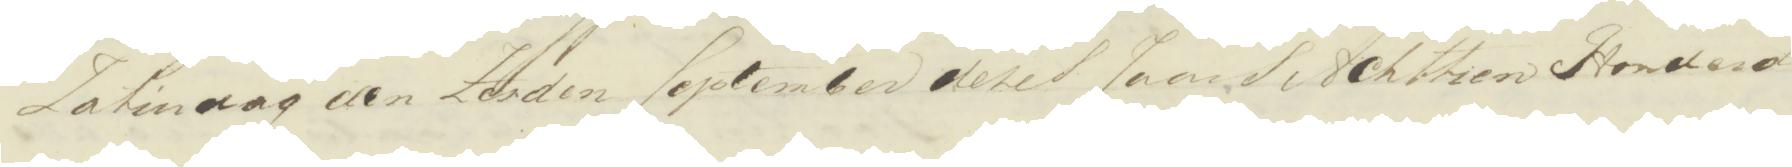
Zaterdag den zesden September dezes Jaars Achttien Honderd
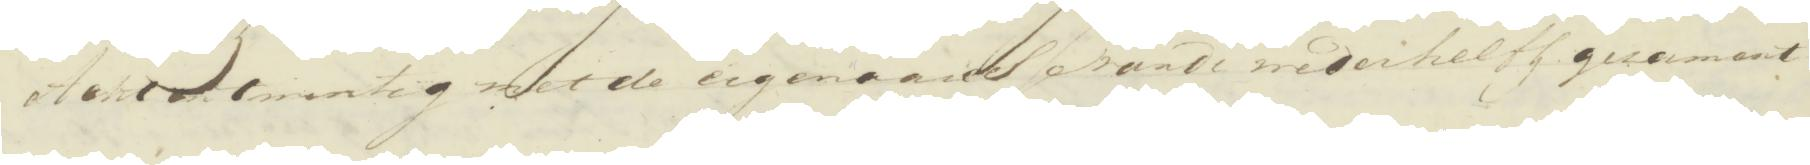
Acht en twintig met de eigenaares So vande wederhelft gesament
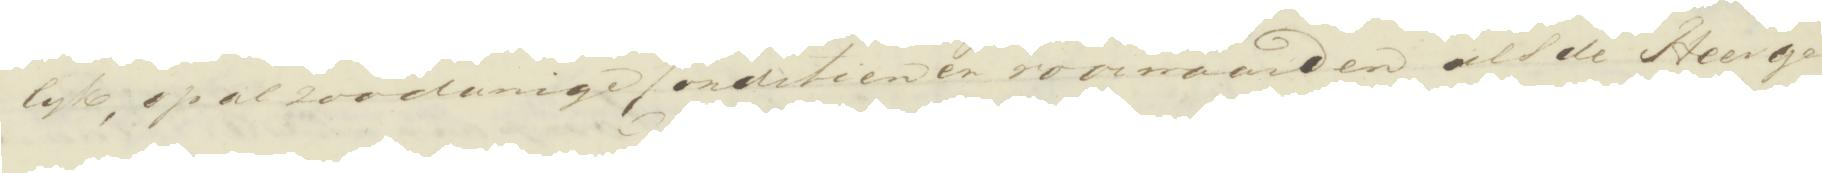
lyk, op al zoodanige Conditien en voorwaarden als de Heer ge
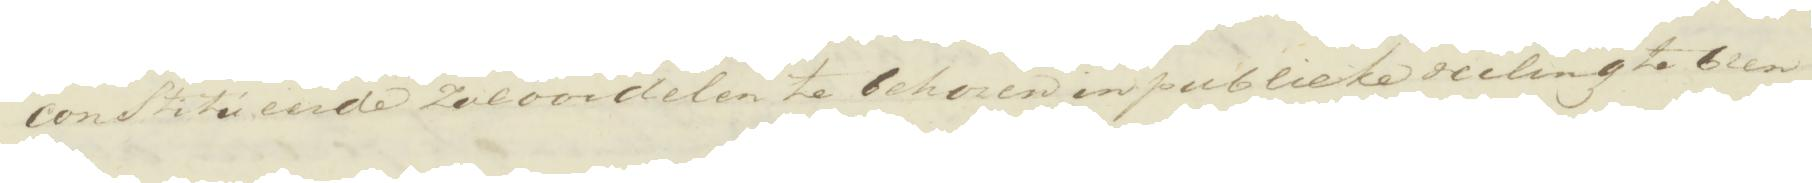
constitueerde zal oordelen te behoren in publieke veiling te bren
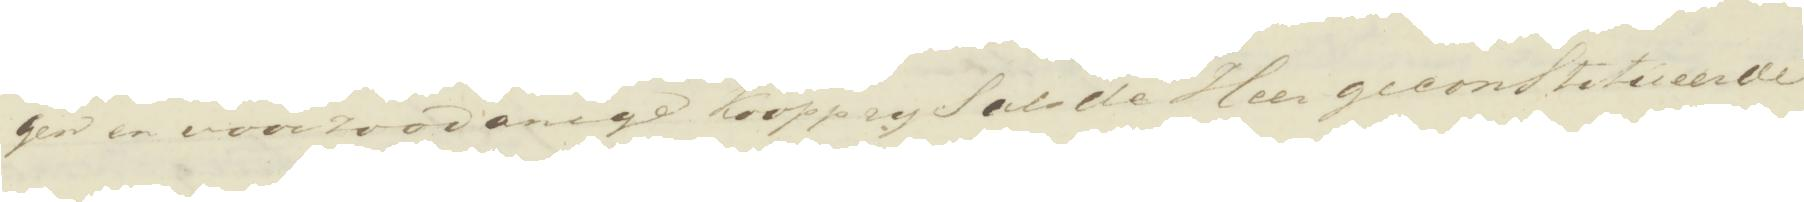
gen en voor zoodanige koopprys als de Heer geconstitueerde
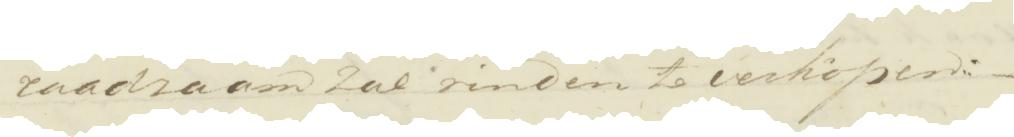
raadzaam zal vinden te verkopen:
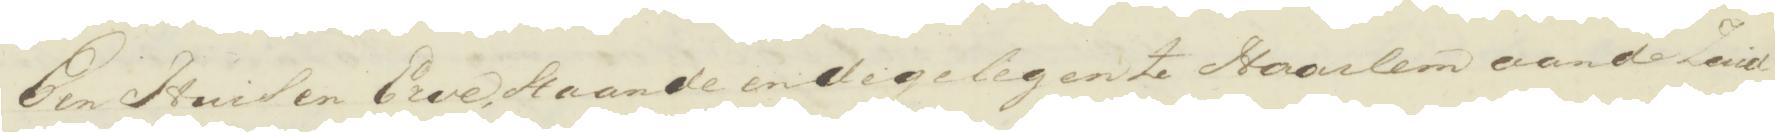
Een Huis en Erve, staande ende gelegen te Haarlem aan de Zuid
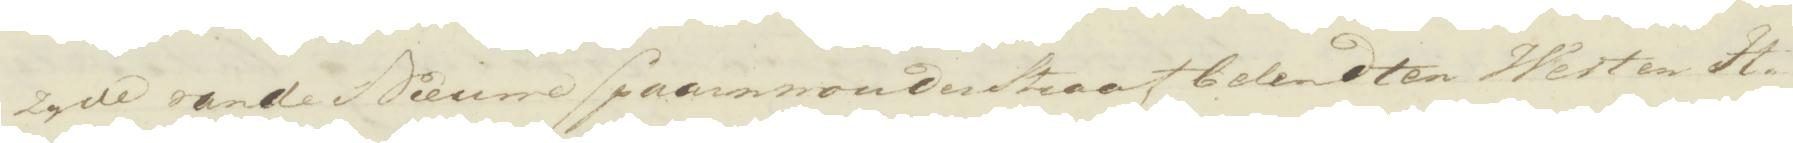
zyde van de Nieuwe Spaarnwouderstraat belend ten Westen H.
